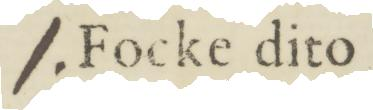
1. Focke dito
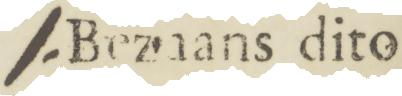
1. Bezaans dito
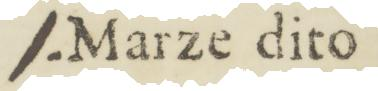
1. Marze dito
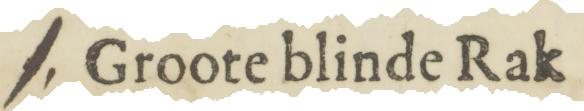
1. Groote blinde Rak
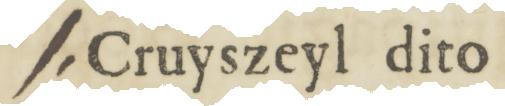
1. Cruyszeyl dito
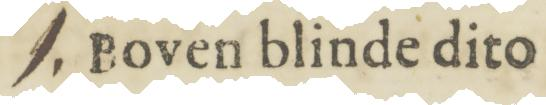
1. Boven blinde dito
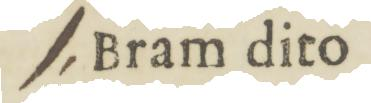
1. Bram dito
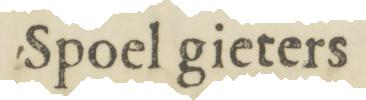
. Spoel gieters
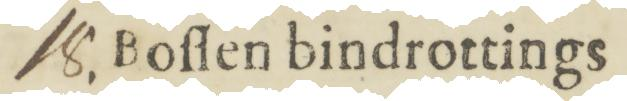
18: Bossen bindrottings
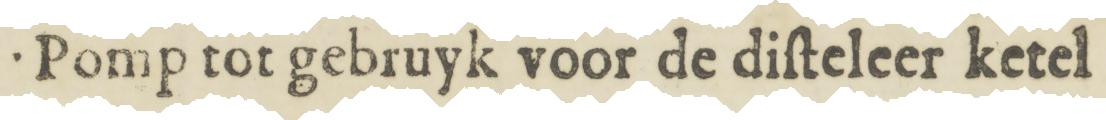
. Pomp tot gebruyk voor de disteleer ketel
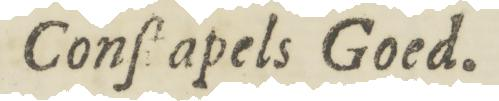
Constapels Goed.
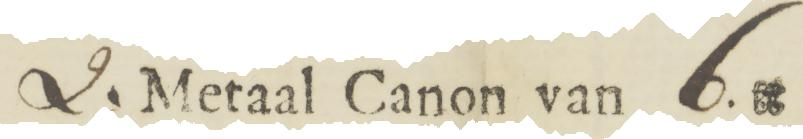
2. Metaal Canon van 6. lb
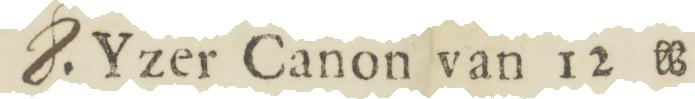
8. Yzer Canon van 12 lb
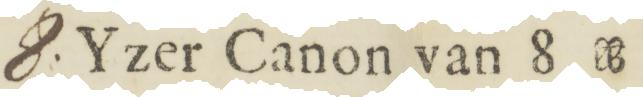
8. Yzer Canon van 8 lb
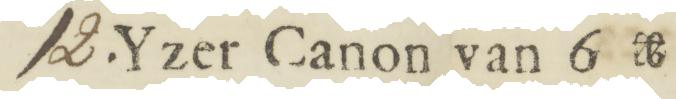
12. Yzer Canon van 6 lb
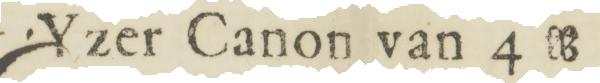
. Yzer Canon van 4 lb
